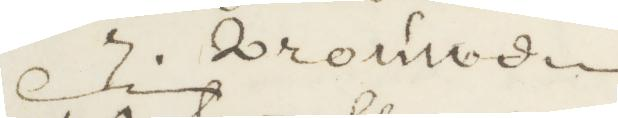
7. vrouwen
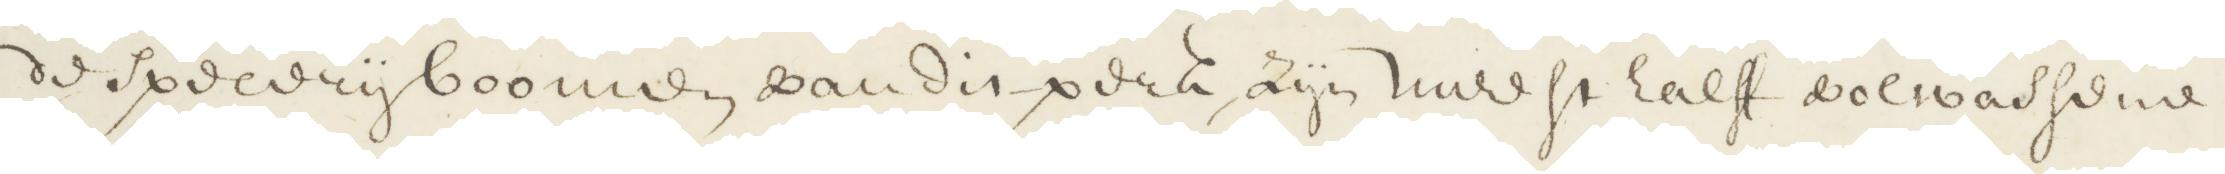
de specerijboomen van dit perk, zijn meest half volwassene
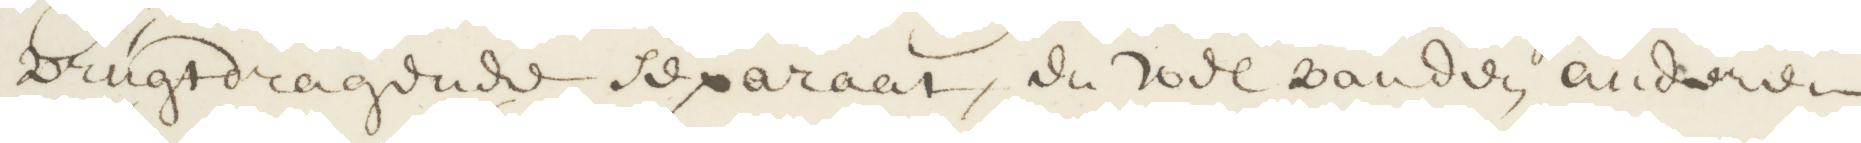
vrugtdragende, separaat, en wel van den anderen
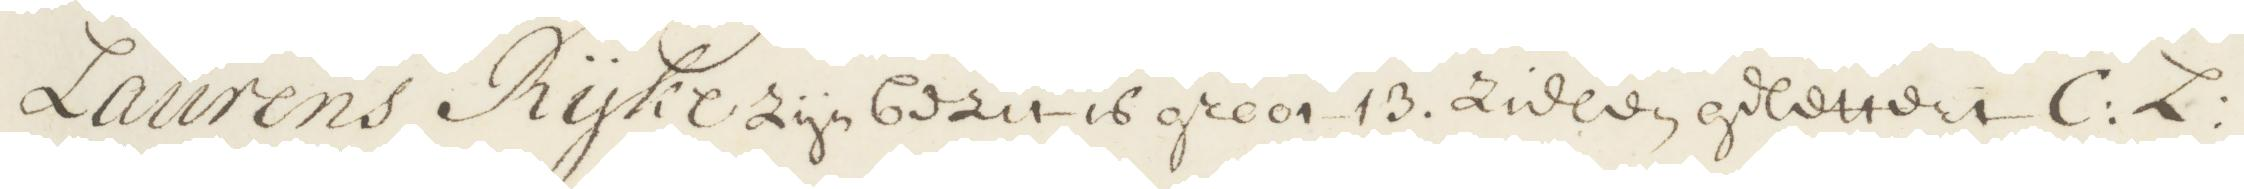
Laurens Rijke zijn bezit is groot 13. Zielen gelettert C: L:
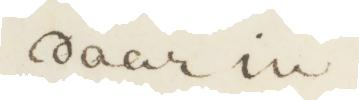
daar in
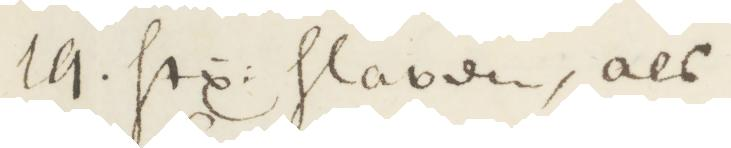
14. stx: slaven, als
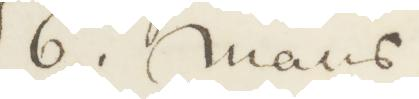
6. mans
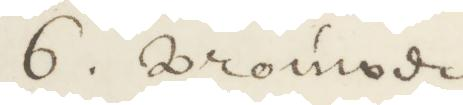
6. vrouwen
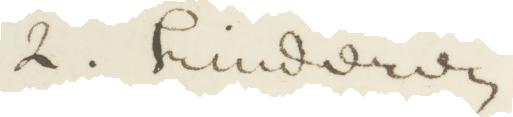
2. kinderen
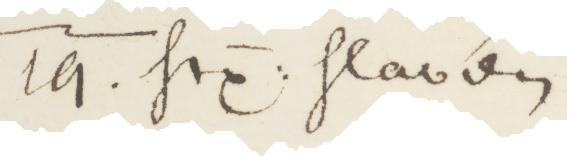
14. stx: slaven
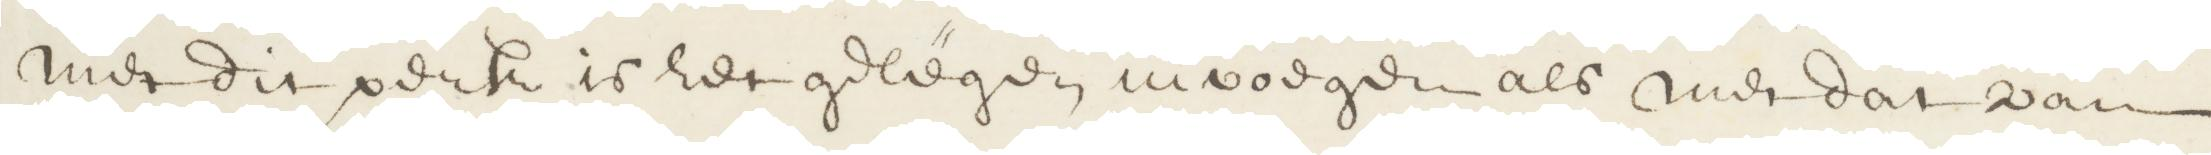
met dit perk is het gelëgen invoegen als met dat van
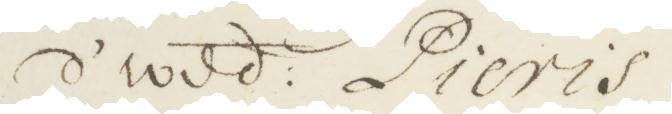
d’wed: Pieris
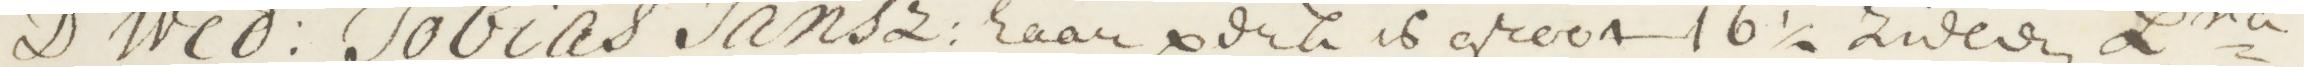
D' Wed: Tobias Iansz: haar perk is groot 16½ zielen L=ra
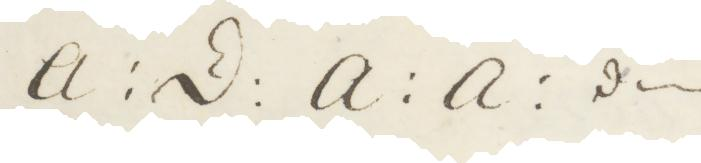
A: E: A: A: en
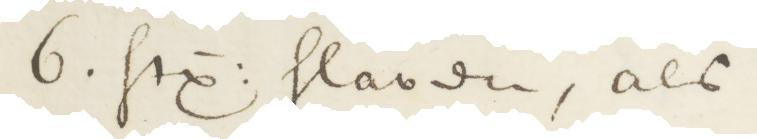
6. stx: slaven, als
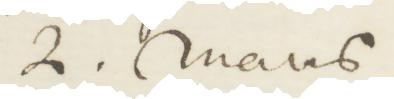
2. mans
